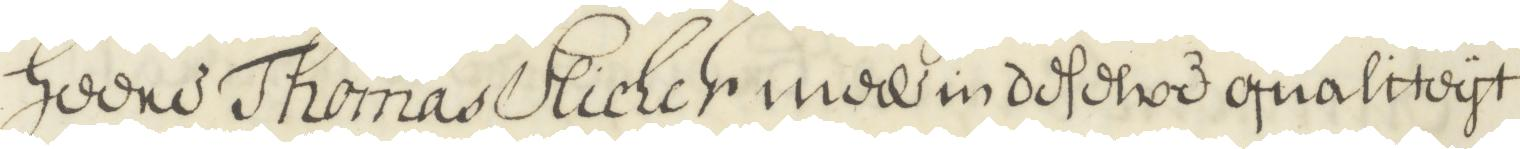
heere Thomas Slicher mede in deselve qualiteijt
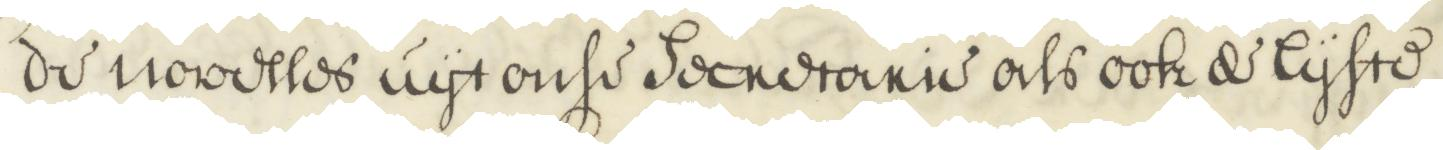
de novelles uijt onse Secretarie als ook de lijste
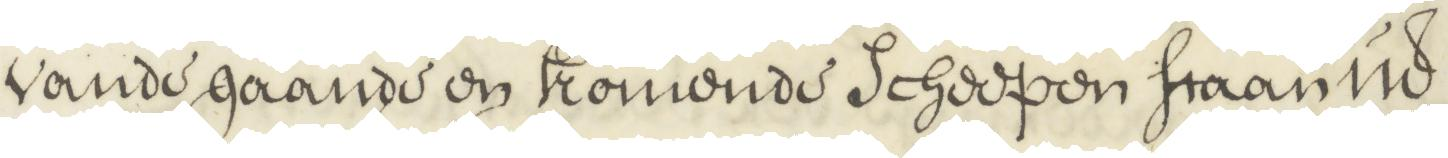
vande gaande en komende scheepen staan UE
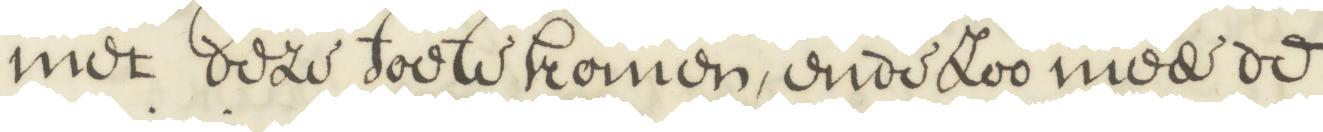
met deze toe te komen, ende zoo mede de
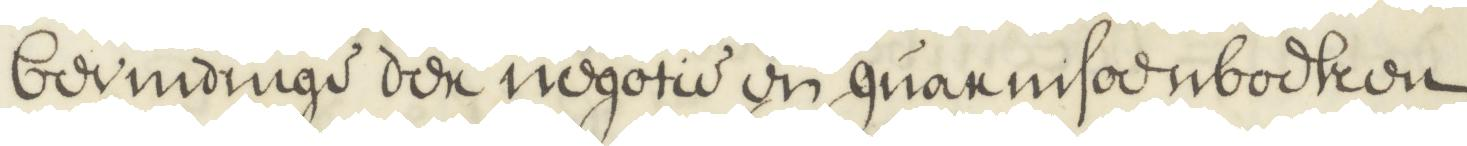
bevindinge der negotie en guarnisoenboeken
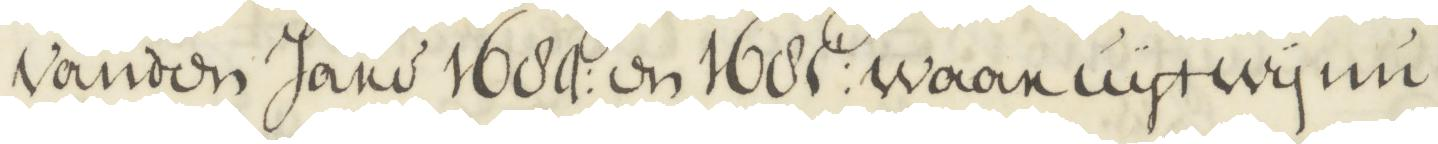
van den Jare 1684: en 1685: waar uijt wij nu
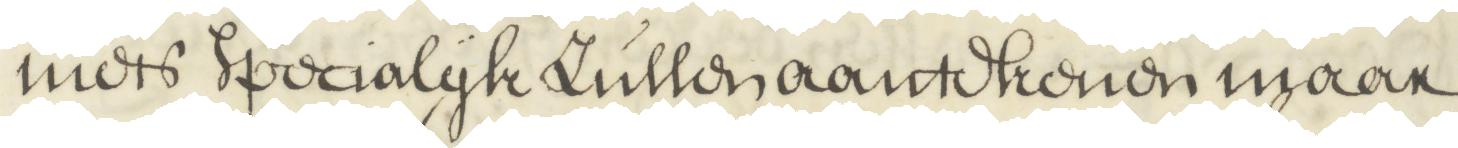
niets specialijk zullen aantekenen maar
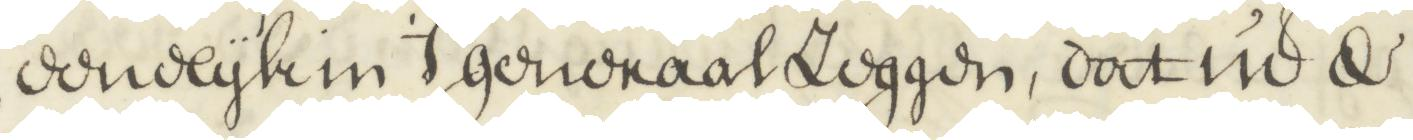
eenelijk in 't generaal zeggen, dat uE de
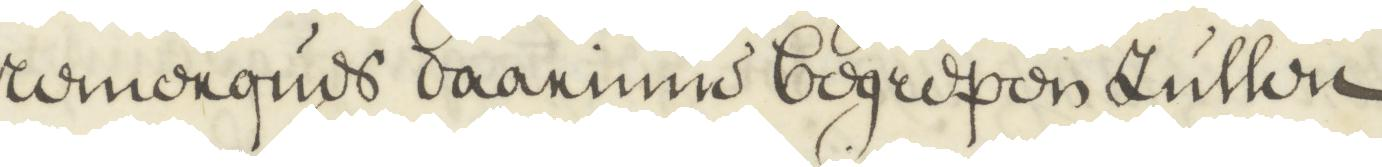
remerques daarinne begrepen zullen
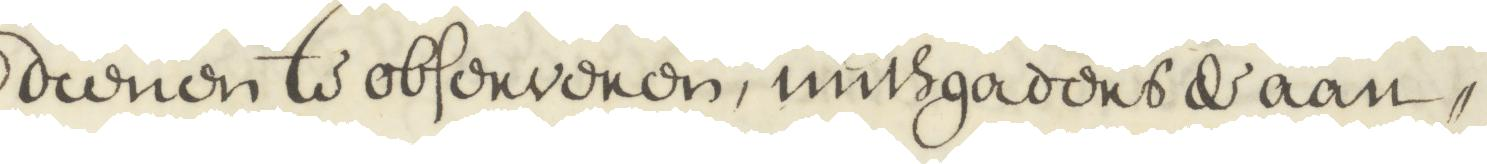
dienen te observeren, mitsgaders de aan„
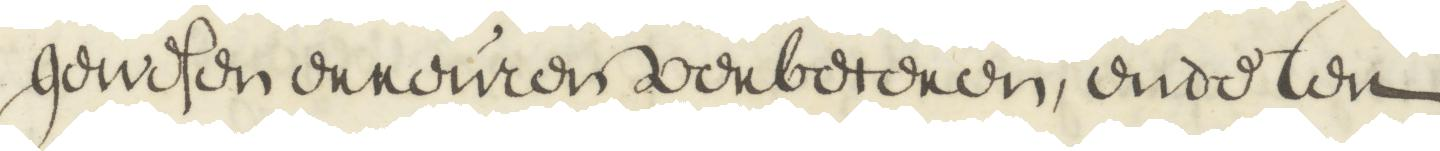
gewesen erreuren verbeteren, ende ten
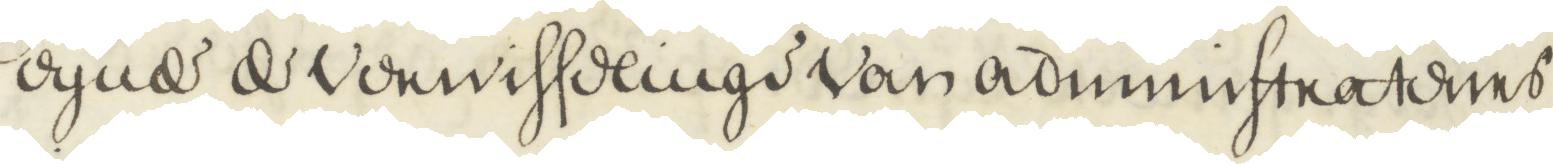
eijnde de verwisselinge van administrateurs
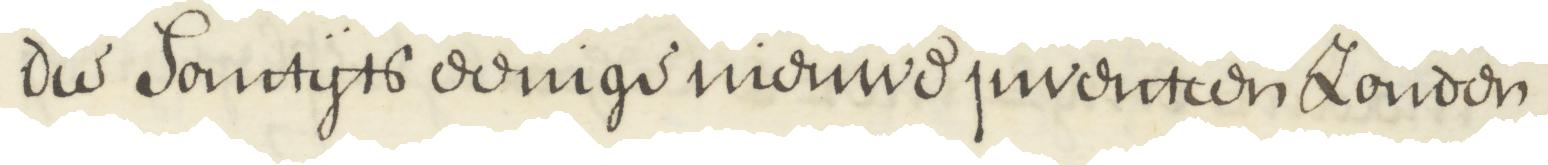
die somtijts eenige nieuwe inventien zouden
